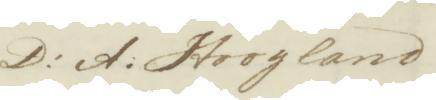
D: A: Hoogland
